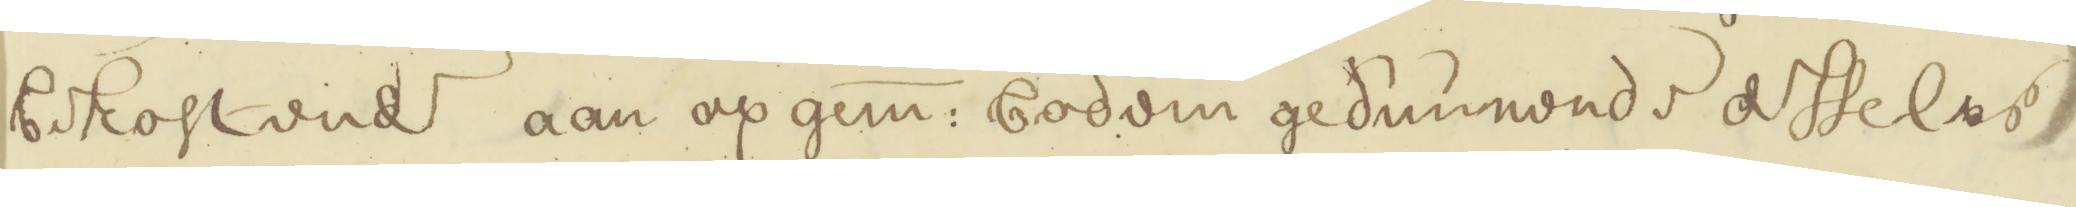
bekostende aan op gem: bodem geduurende desselvs
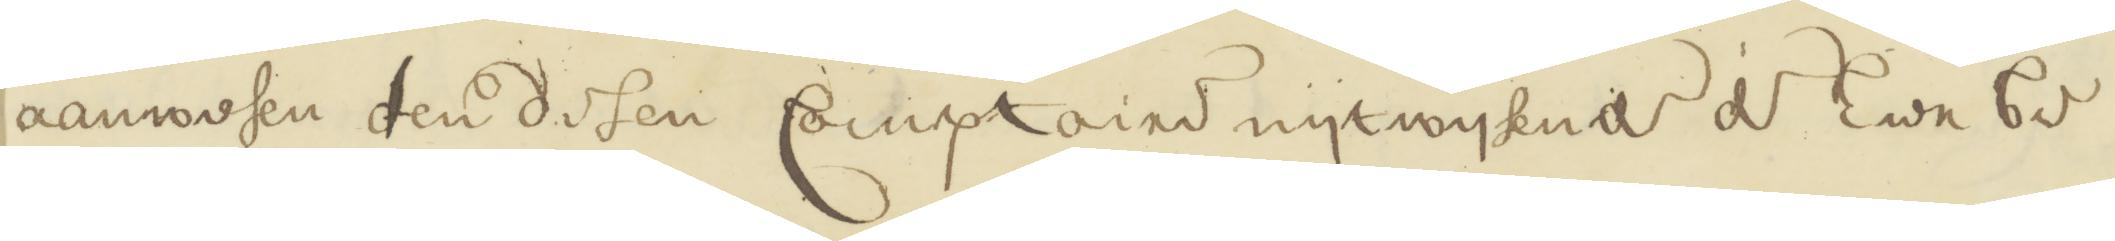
aanwesen ten desen Comptoire uijtwijkende de hier be
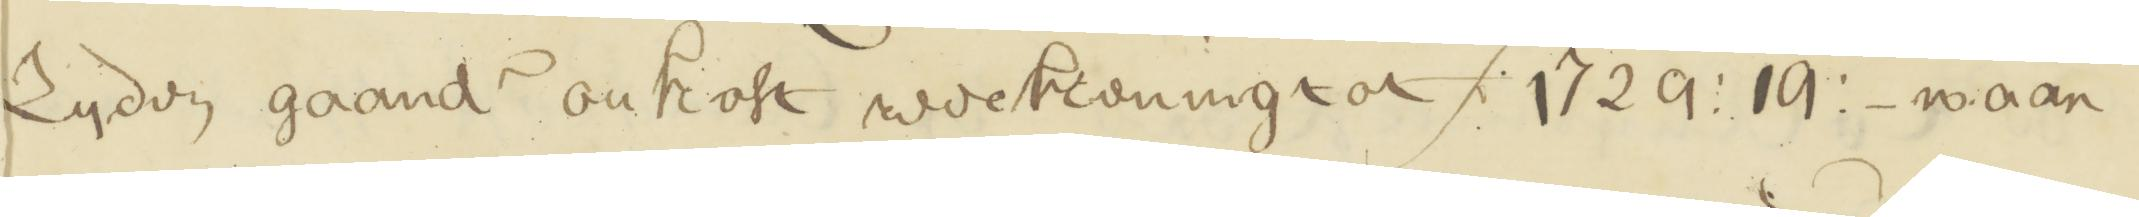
zyden gaande onkost reeckening tot ƒ1724: 14: – waar
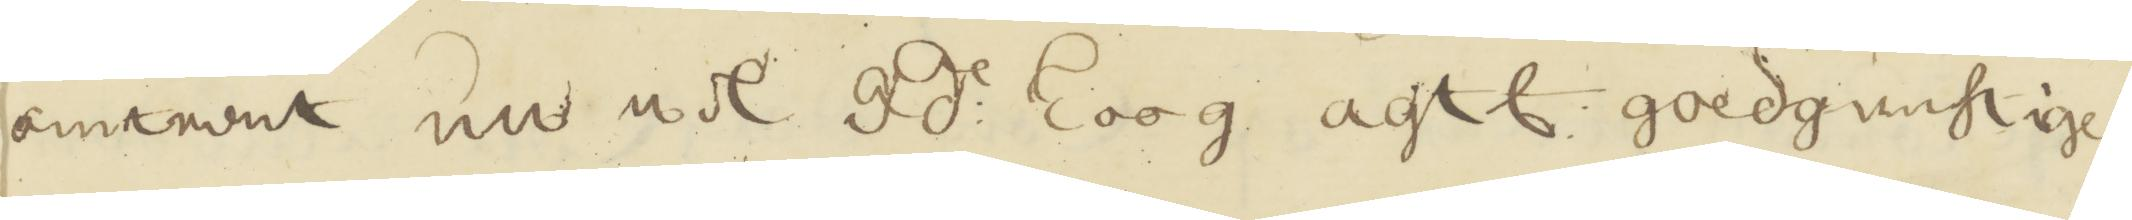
omtrent uw wel Ed:e Hoog agtb: goedgunstige
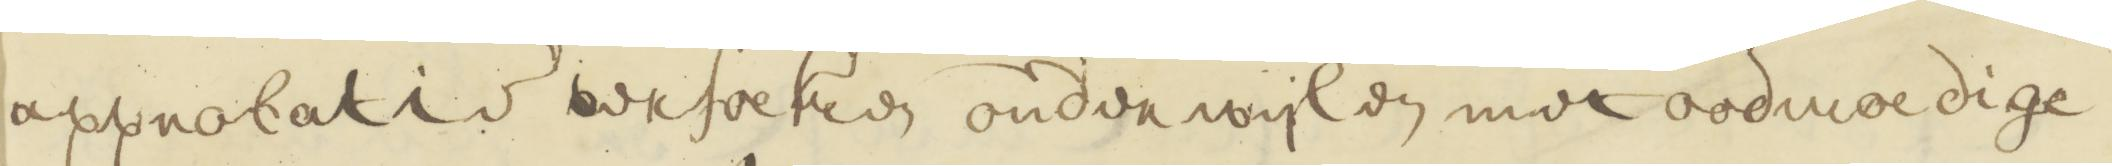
approbatie versoeken onderwijl en met oodmoedige
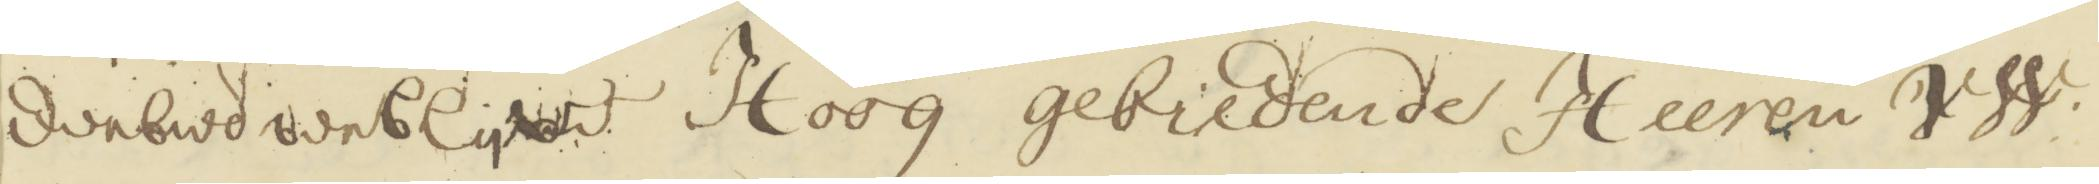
Eerbied verblijve Hoog gebiedende Heeren VW:
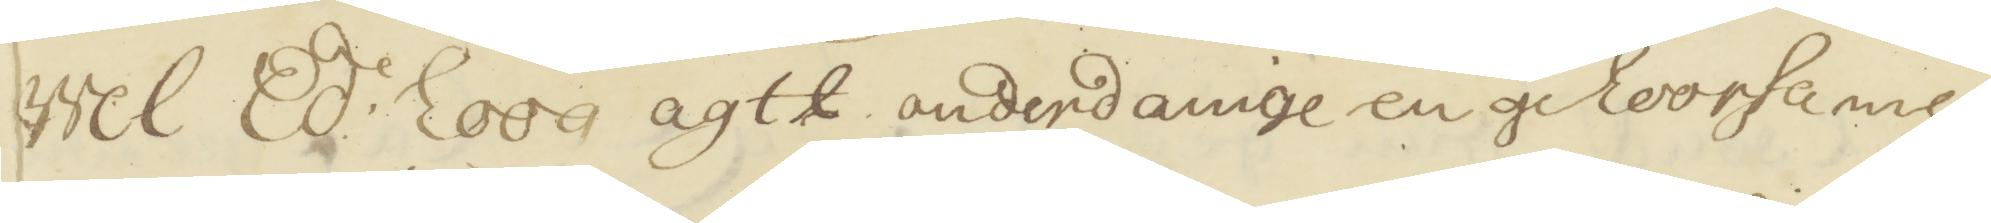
Wel Ed:e hoog agtb: onderdanige en gehoorsame
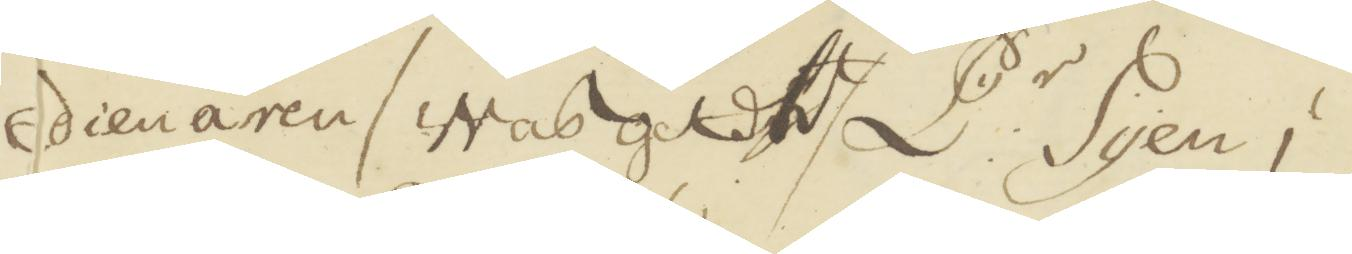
dienaren / was getekt/ P:r Sijen; W:m V: Ghij, E:t
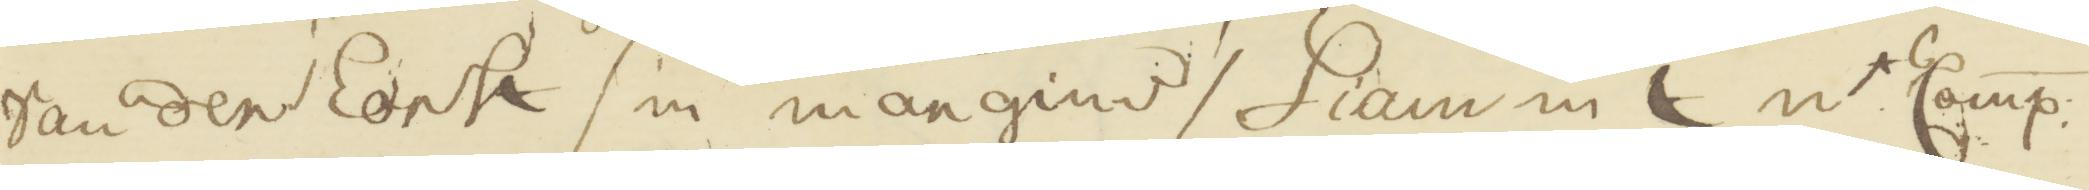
van der horst / in margine / Siam in 't n.t Comp:
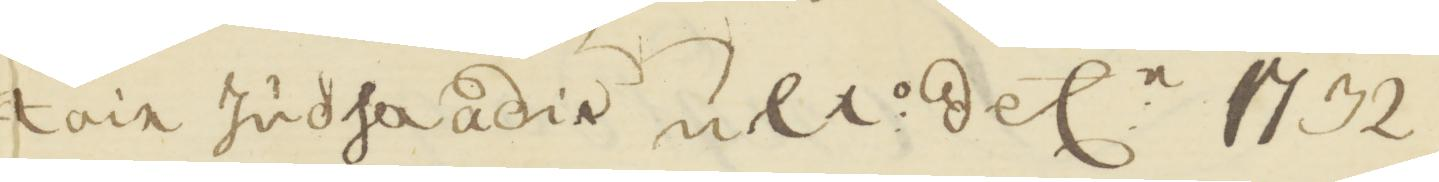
toir Iudja adir ult:o dec:r 1732.
